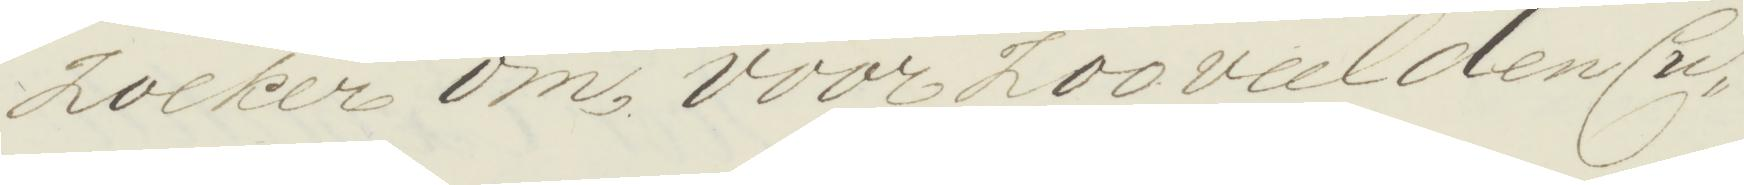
zoeker om, voor zoo veel den Cu„
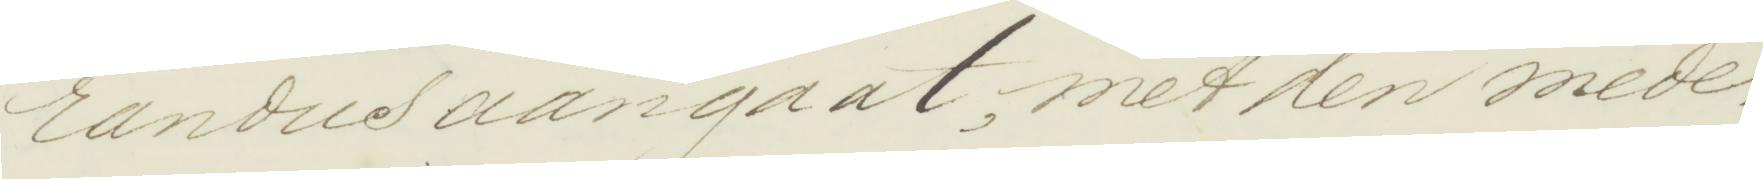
randus aangaat met den mede„
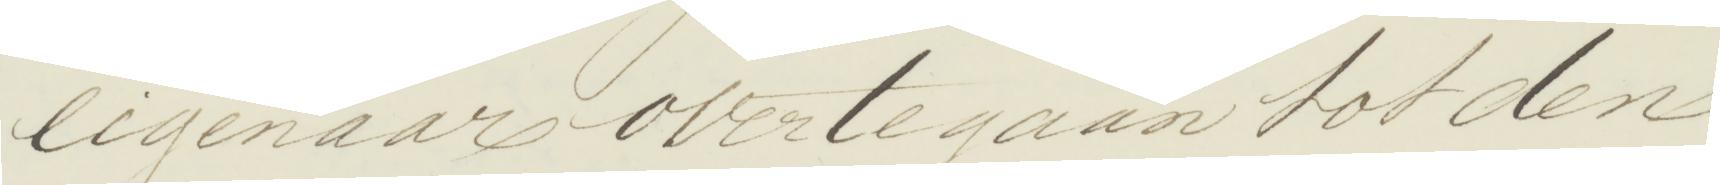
eigenaar over te gaan tot den
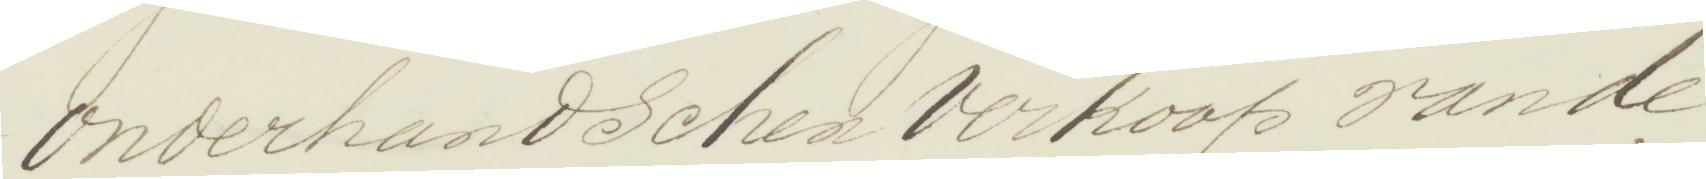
Onderhandschen verkoop van de
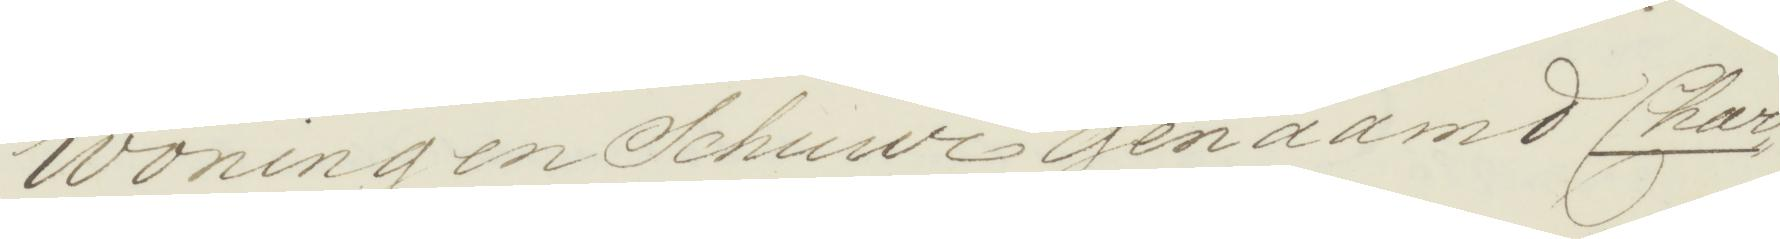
Woning en Schuur genaamd Char„
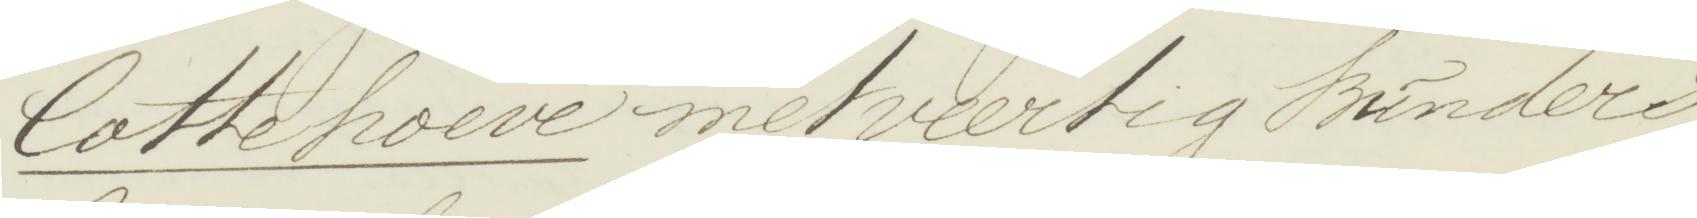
lotte hoeve met veertig Bunders
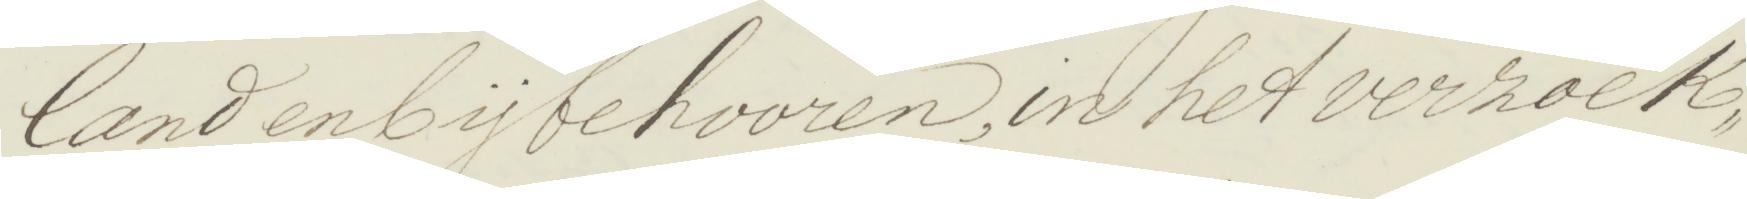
land en bijbehooren, in het verzoek„
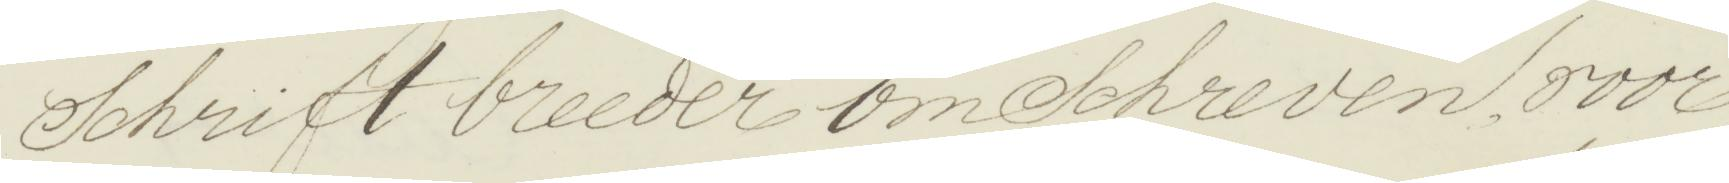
schrift breeder omschreven, voor
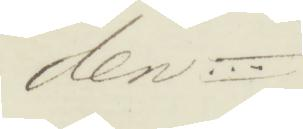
den ...
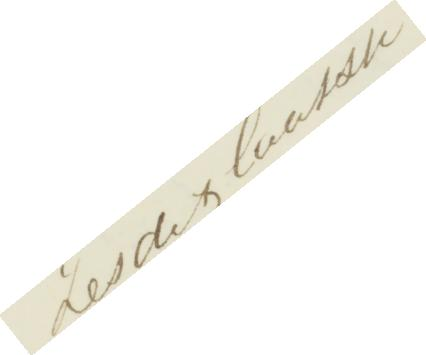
zesdit laatste
